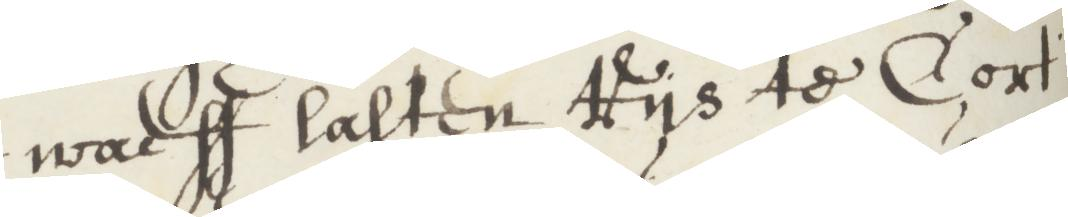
twaeff lasten Rijs te Cort is
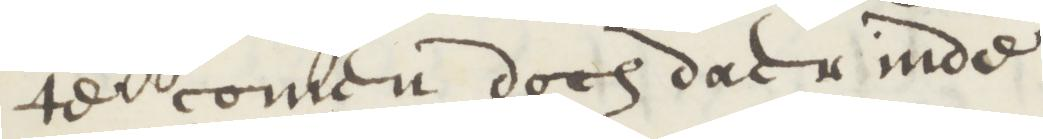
te comen doch daer inde
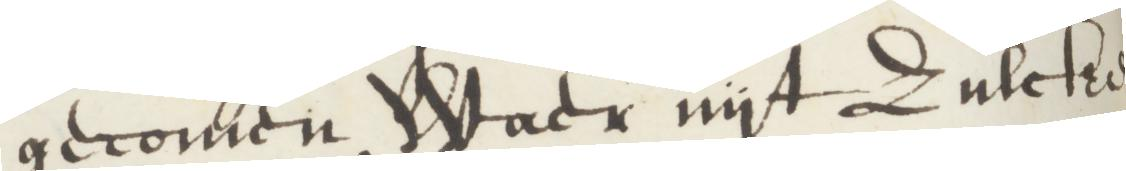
gecomen waer uijt zulcke
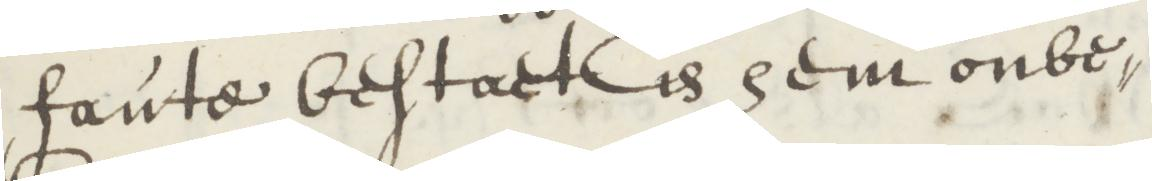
faute bestaet is hem onbe„
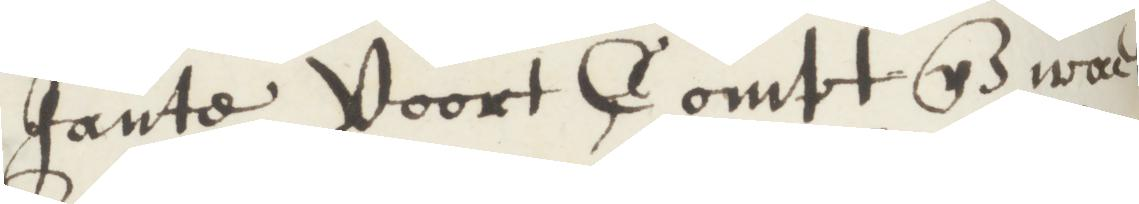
faute voort Compt ende waer
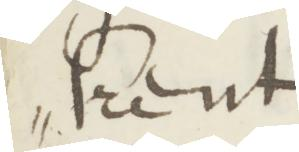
„kent
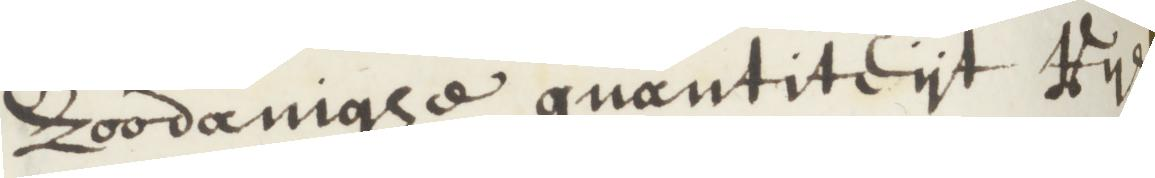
zoodanighe quantiteijt Rys
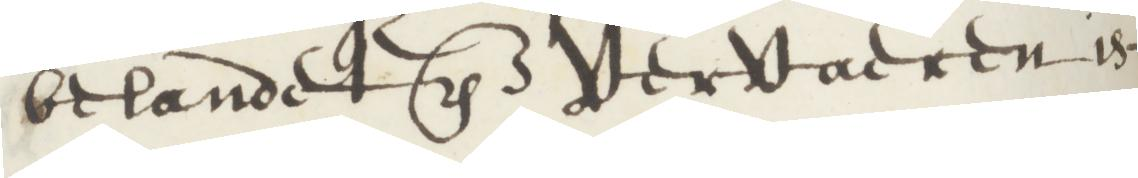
belandet ende vervaeren is
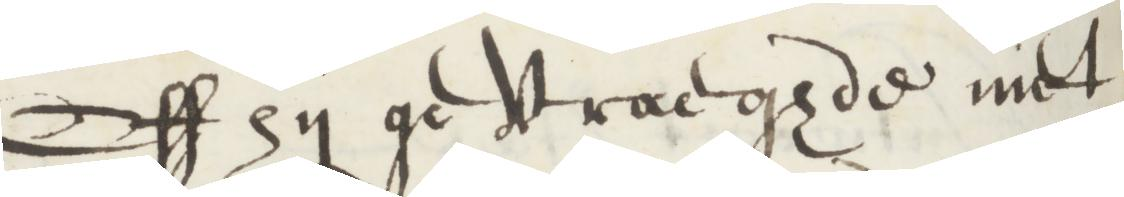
Off sij gevraeghde niet
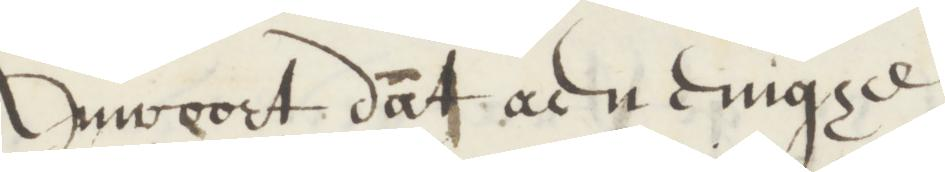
Anwoort dat aen enighe
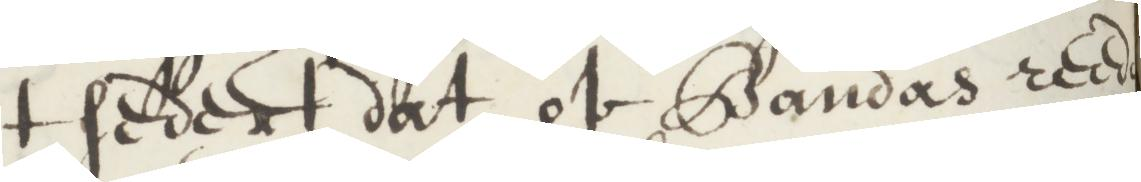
t sedert dat op Bandas reed
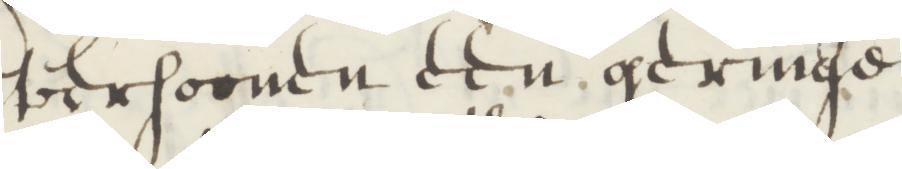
persoonen een geringe
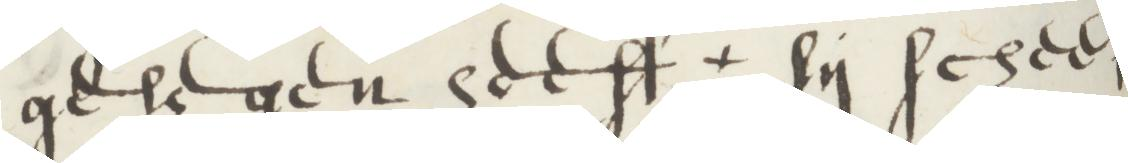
gelegen heeft bij scheeps
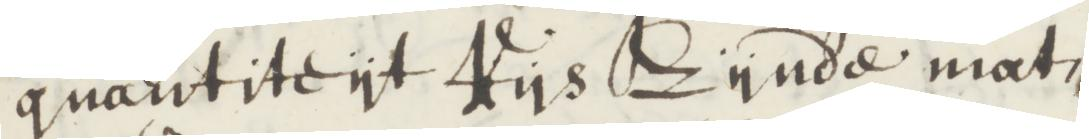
quantiteijt Rijs zijnde mat
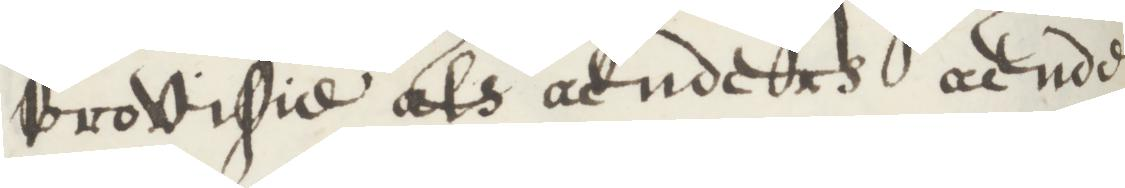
provisie als aendeers aende
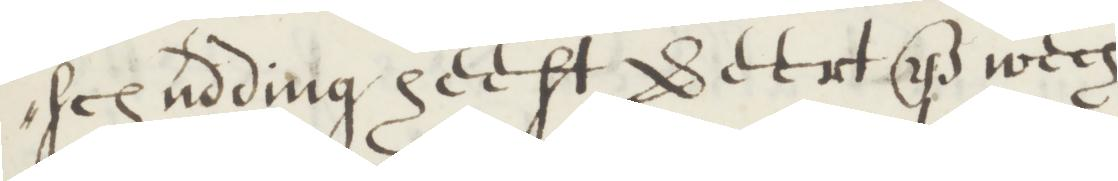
„schudding heeft vereert ende wech
